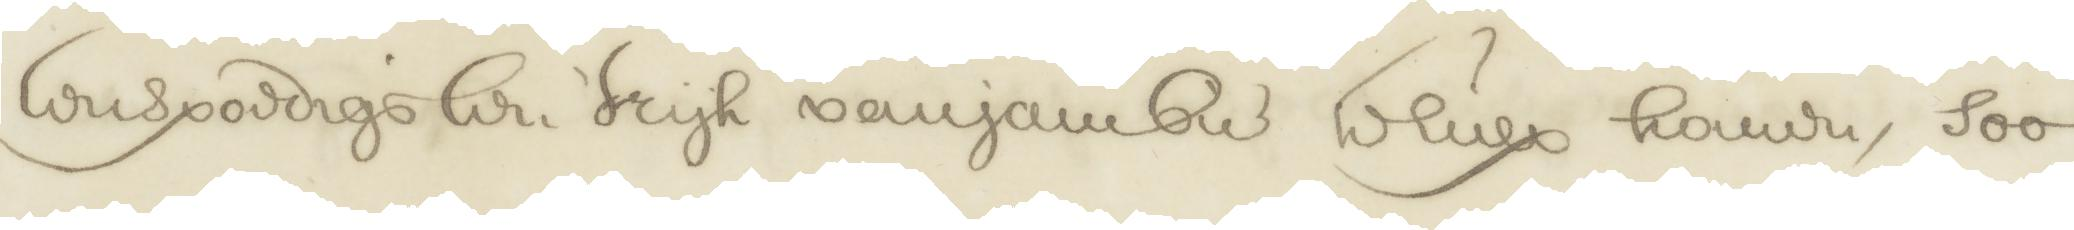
ten spoedigsten 'trijk van jambie te hulp komen, soo
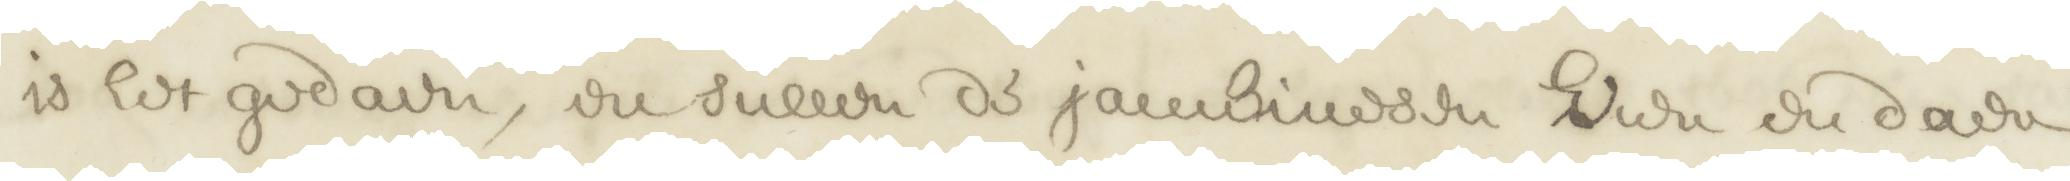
is het gedaen, en sullen de jambinesen hier en daer
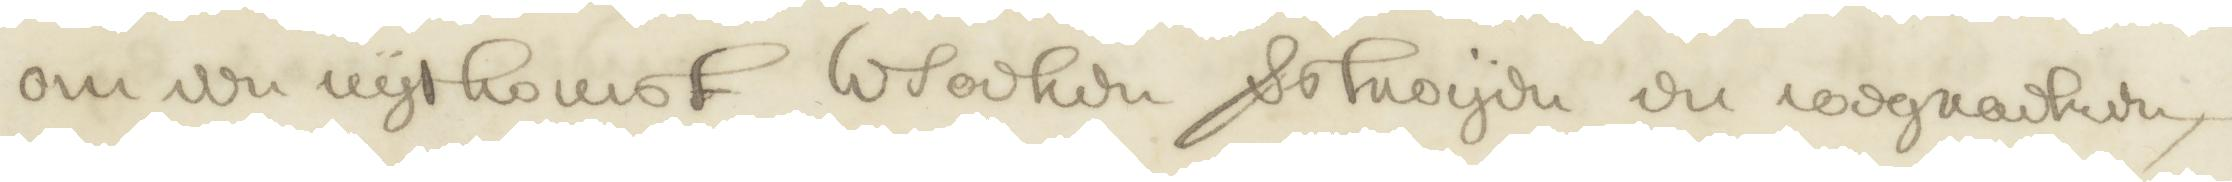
om een uijtkomst te soeken verstroijen en wegraeken,
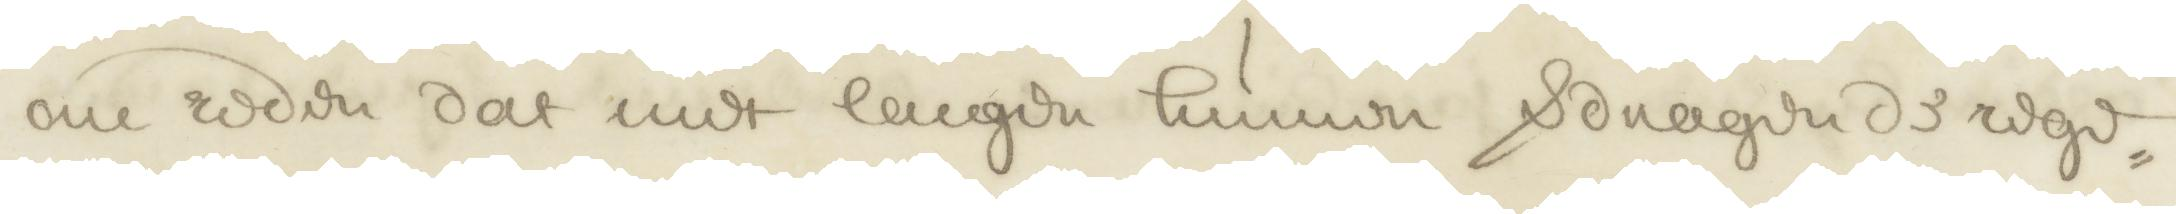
om reden dat niet langen kunnen verdragen de rege„
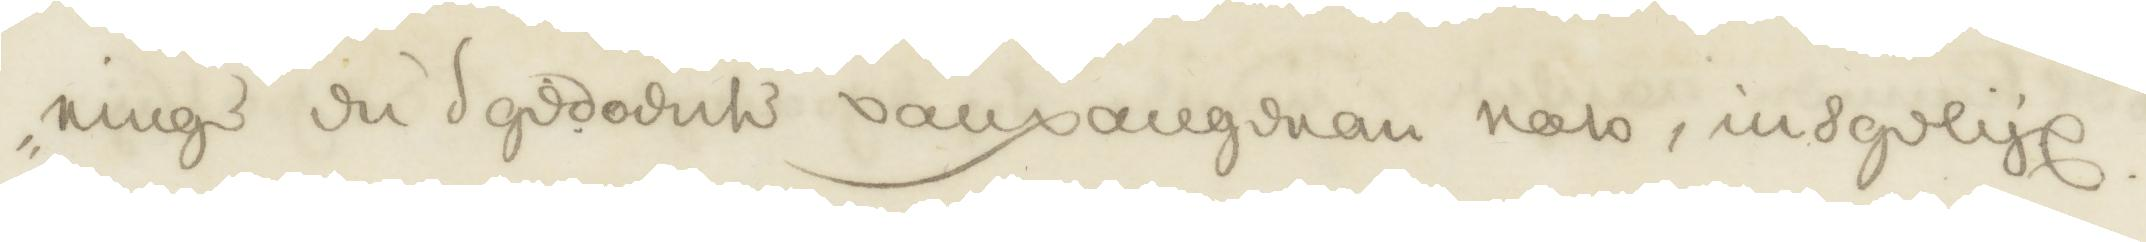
„ringe en 't gedoente van pangeran rato, insgelijx.
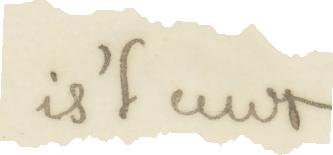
is 't met
